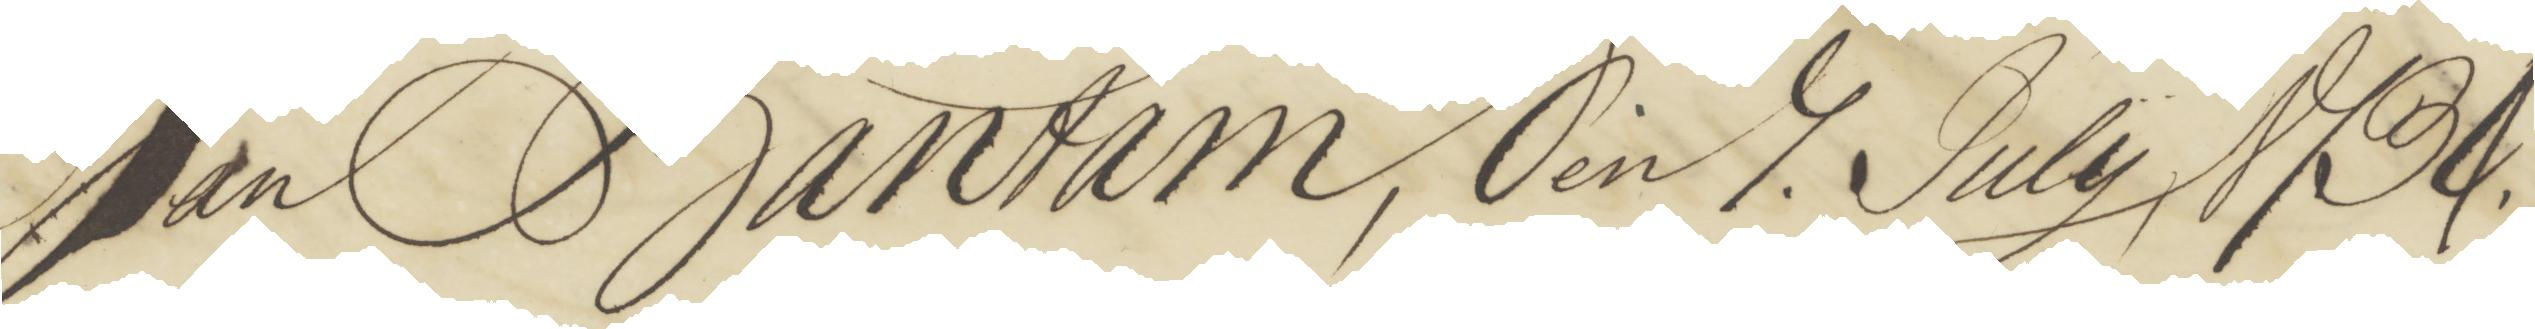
Van Bantam, den 7. Julij, 1734,
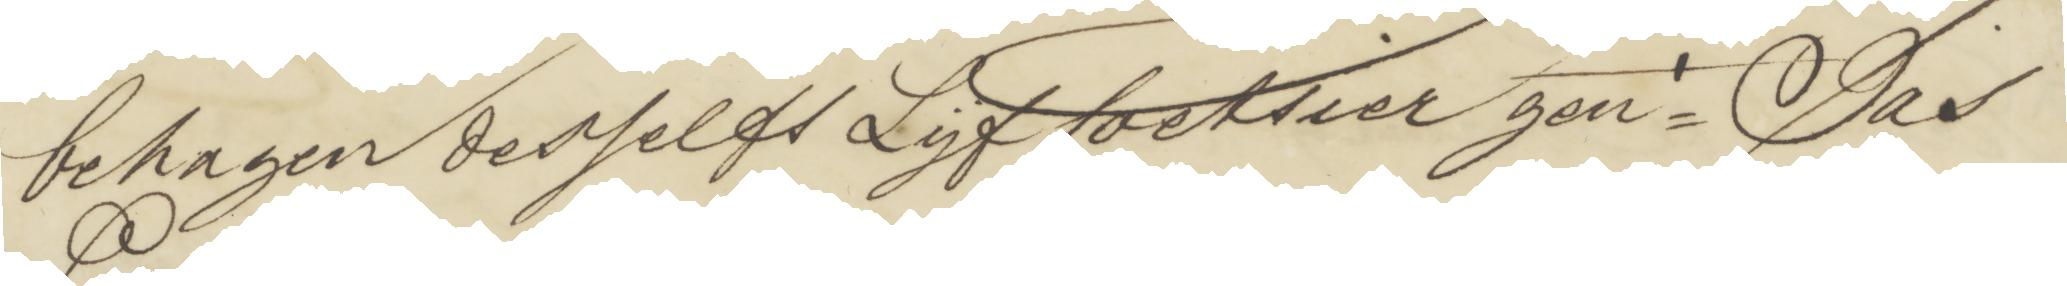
behagen desselfs Lijf Coetsier gen=t Pas
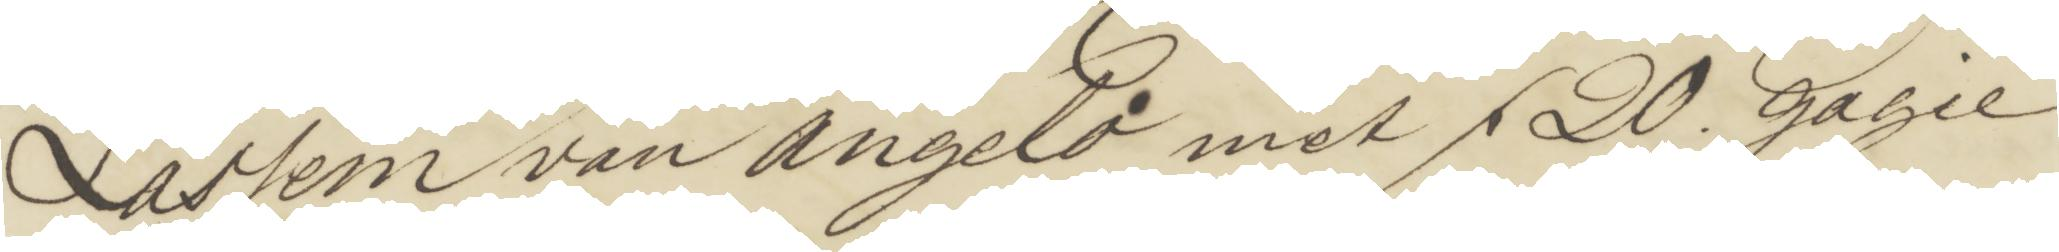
Lassem van angelo met ƒ20. gagie
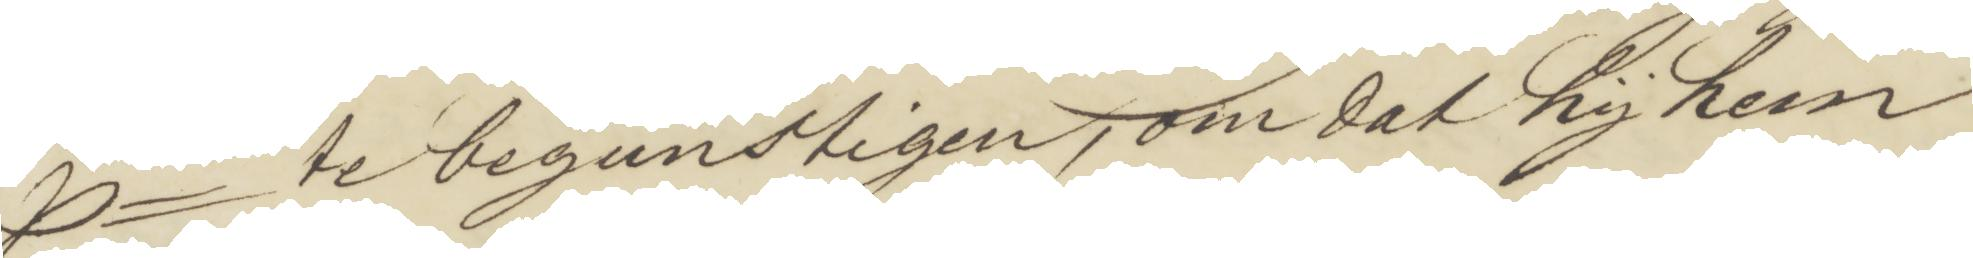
p=mt te begunstigen, om dat hij hem
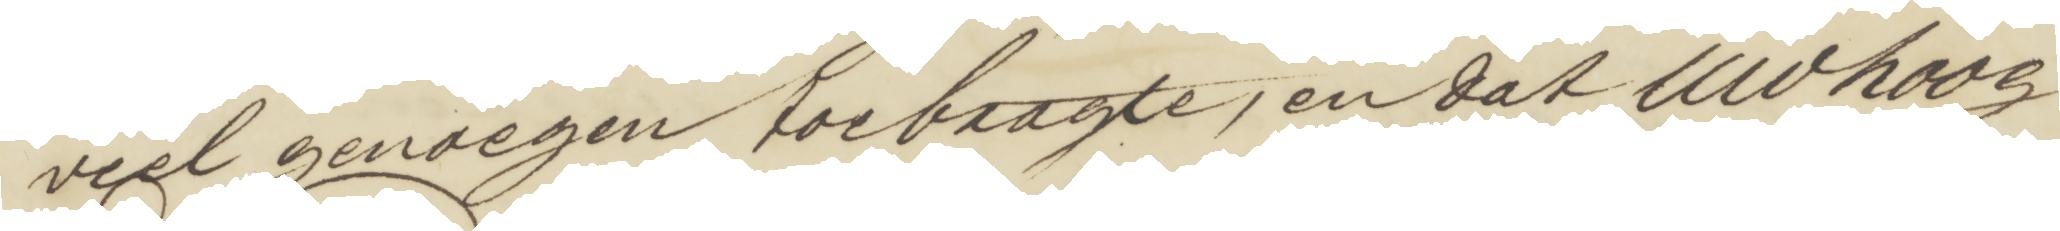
veel genoegen toebragte, en dat UW hoog
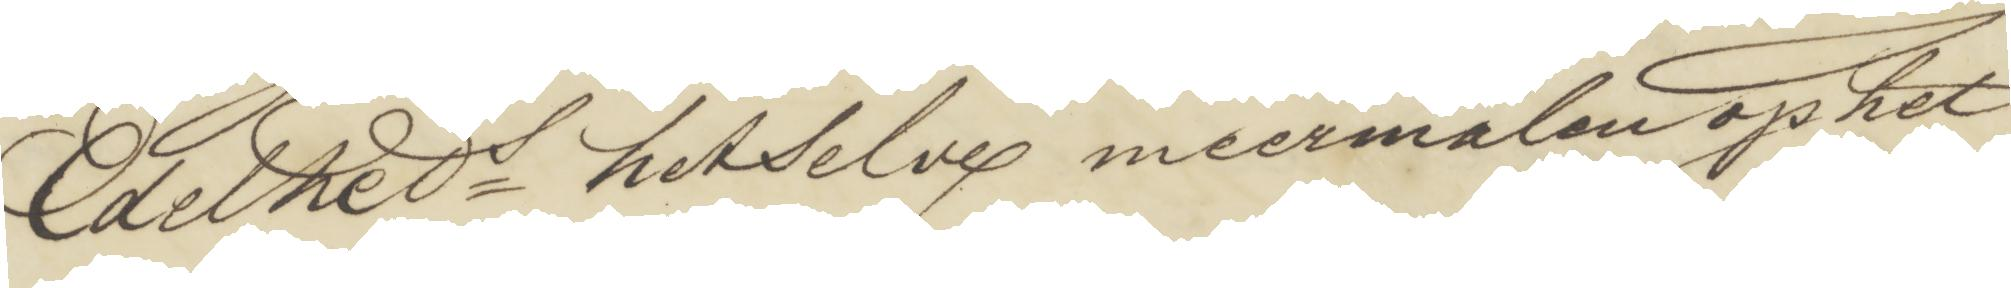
Edelhed=s hetselve meermalen op het
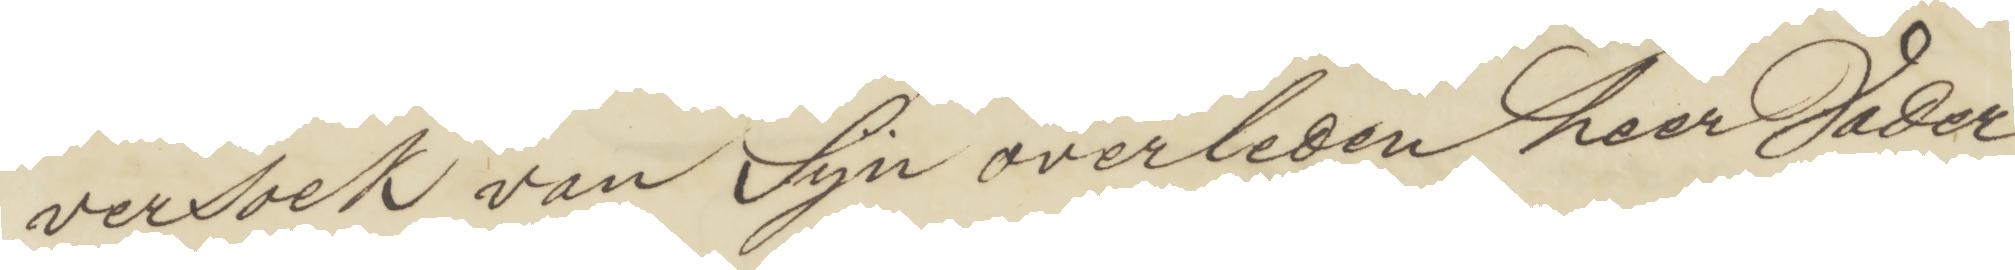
versoek van Sijn overleden heer Vader
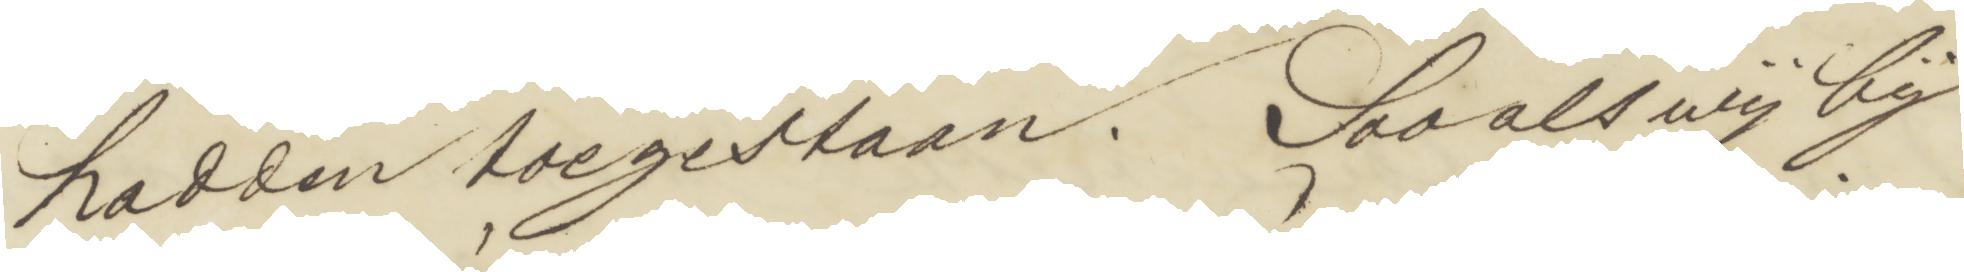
hadden toegestaan. Soo als wij bij
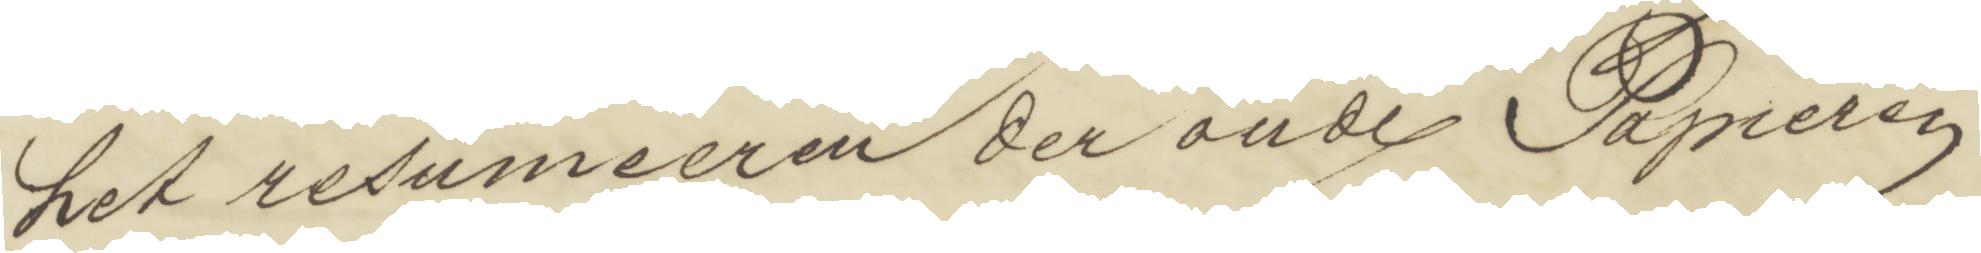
het resumeeren der oude Papieren
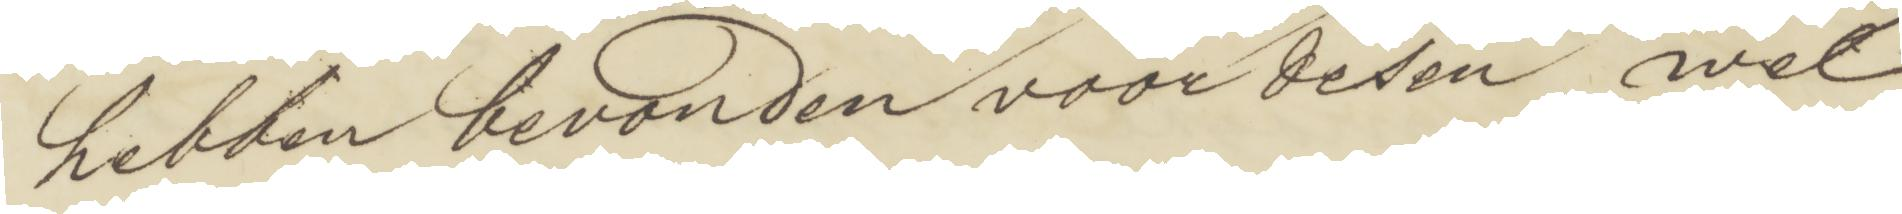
hebben bevonden voor desen wel
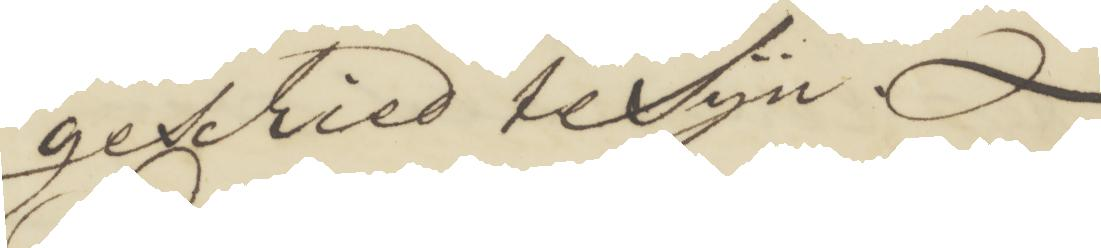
geschied te Sijn.
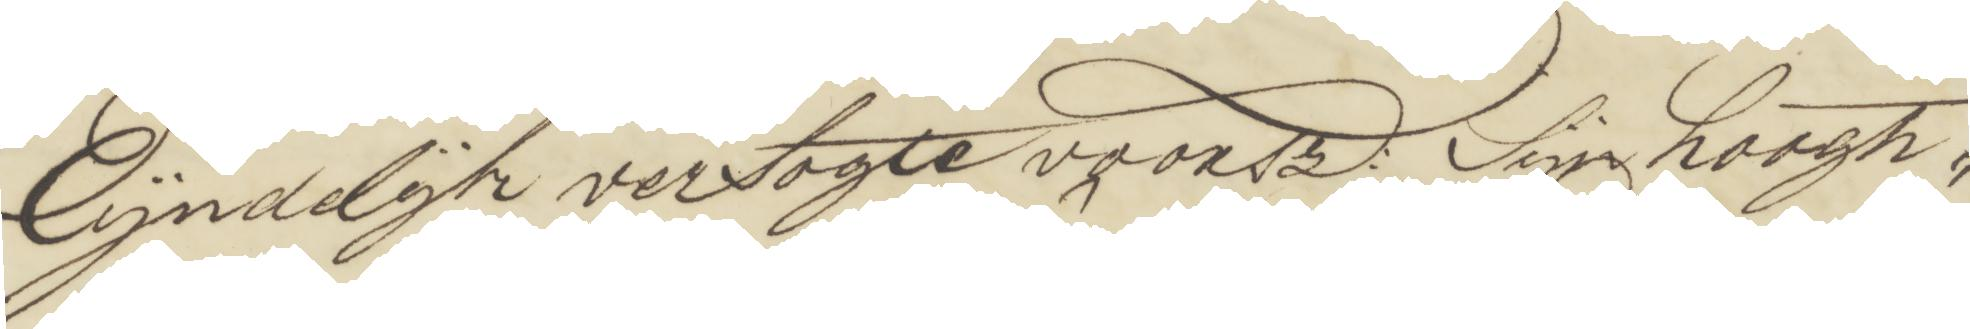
Eijndelijk versogte voorsz: Sijn hoogh„
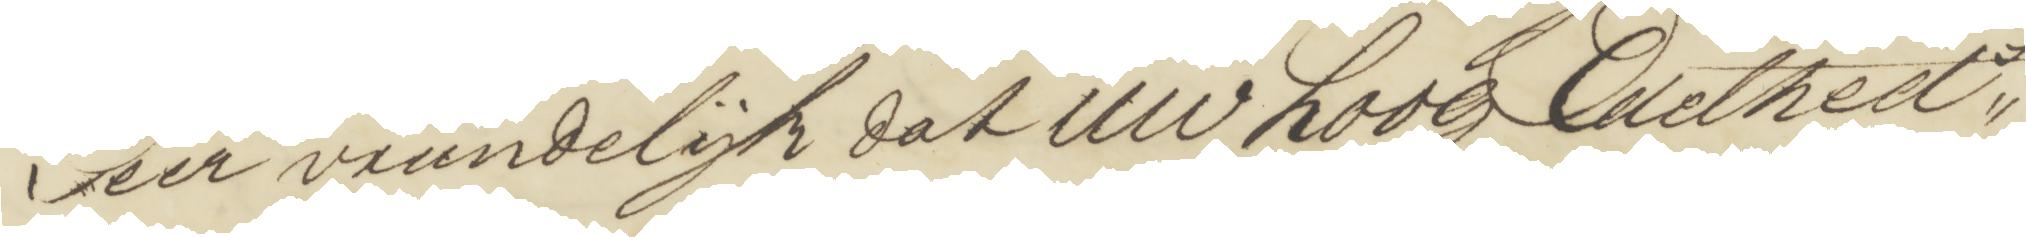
Seer vrundelijk dat uw hoog Edelhed„s
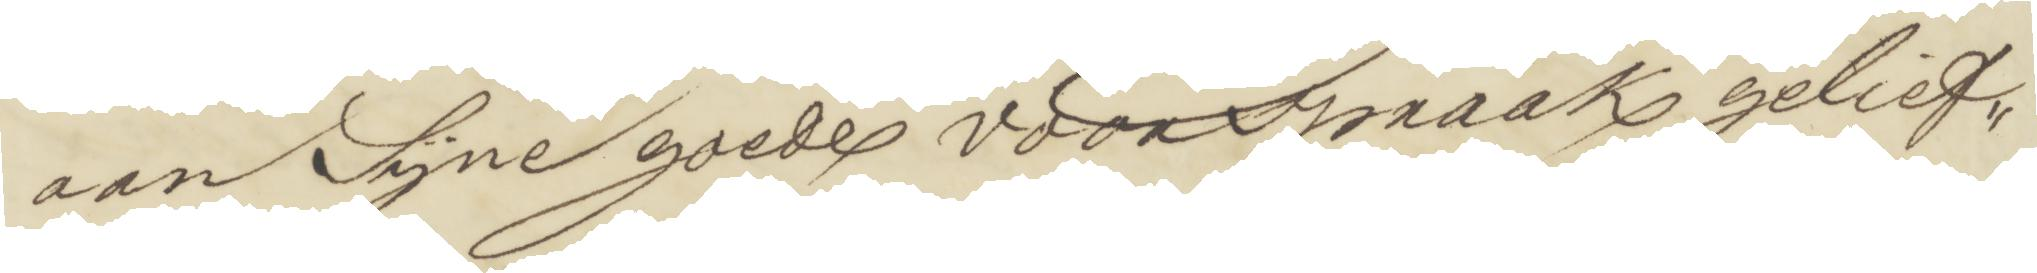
aan Sijne goede voorspraak gelief„
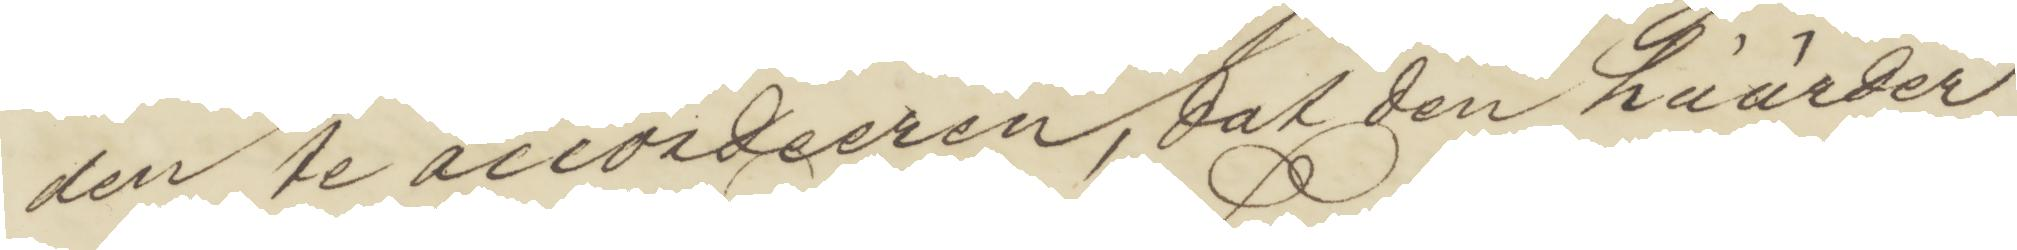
den te accordeeren, dat den huurder
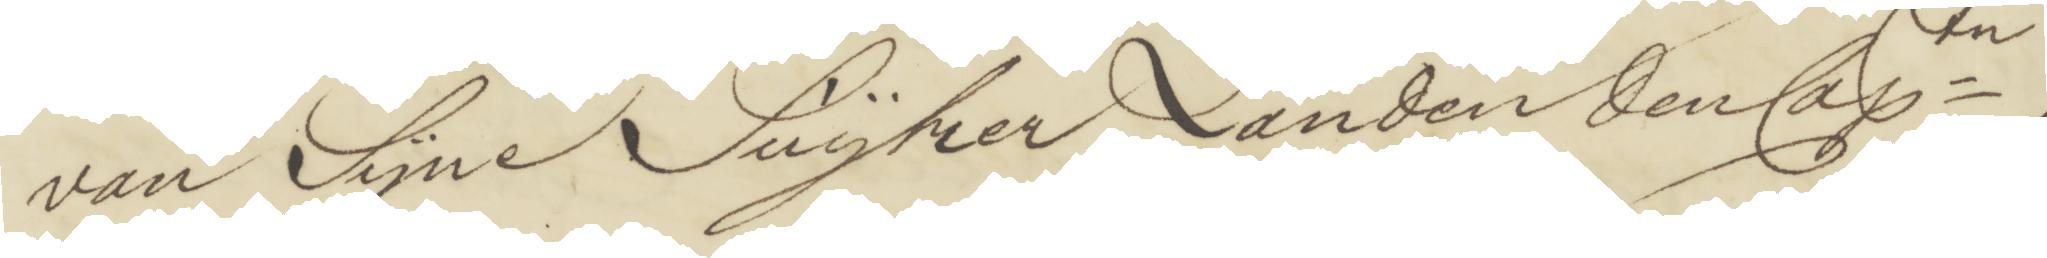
van Sijne Suijker Landen den Cap=tn
